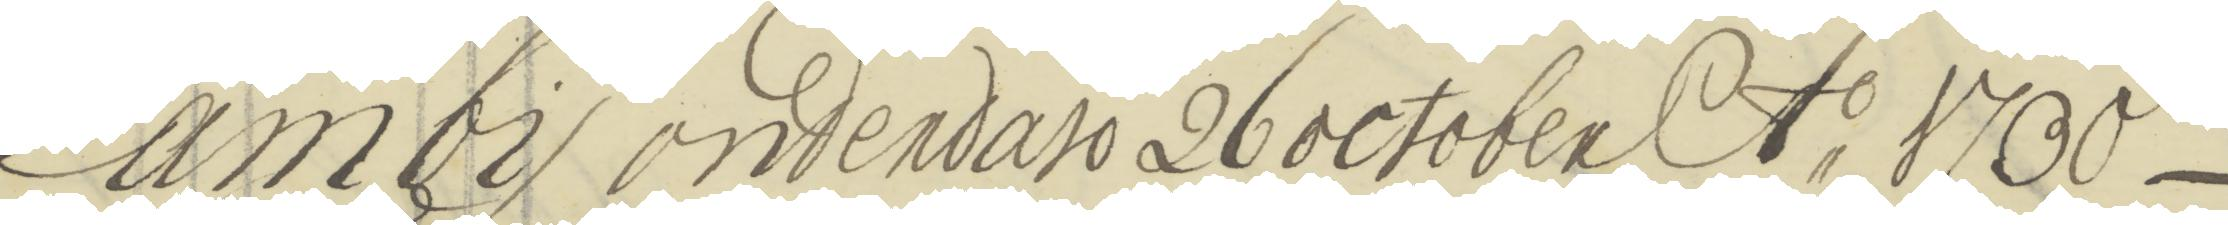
Jambij onder dato 26 october A„o 1730 –
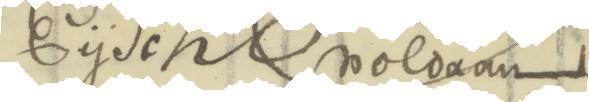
Eijsch voldaan
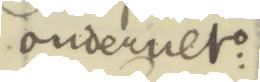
onder ult:o
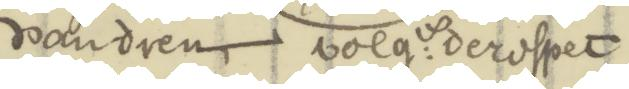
van dien volg:s de respec
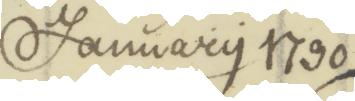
Januarij 1730
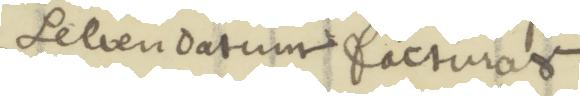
selven datum facturas
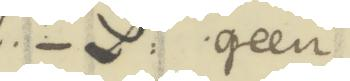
P: geen
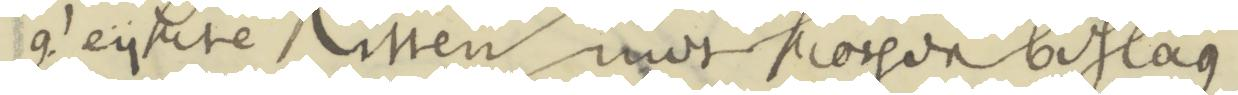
g’eijkte Kitten met koper beslag
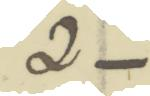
2 –
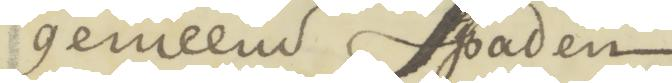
gemeene spaden
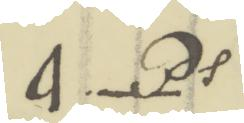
4. – Ps
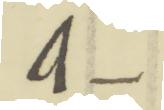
4 –
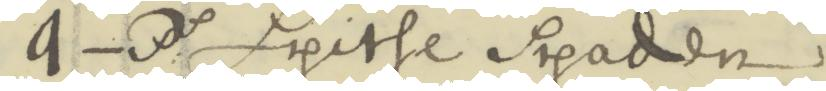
4 – Ps spitse spaden
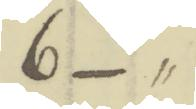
6 – „
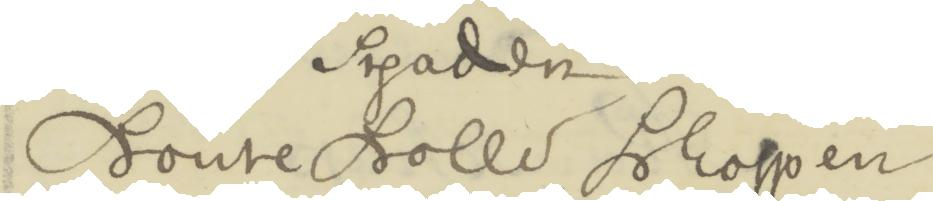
Houte Holle schoppen
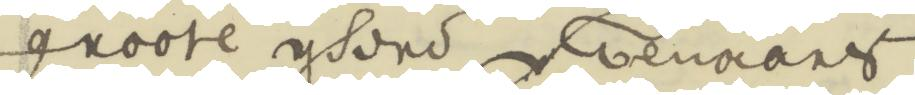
groote ijsere Evenaars
